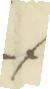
ƒ
